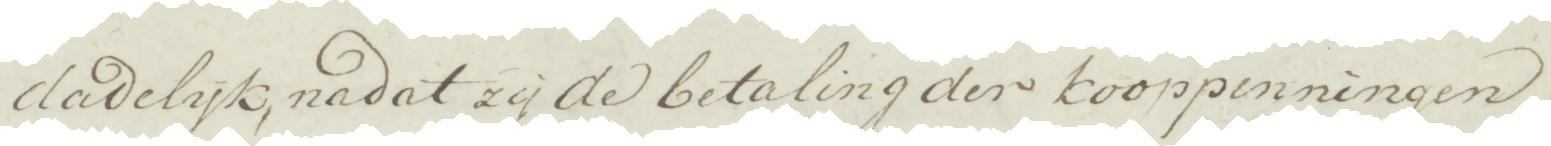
dadelijk, nadat zij de betaling der kooppenningen
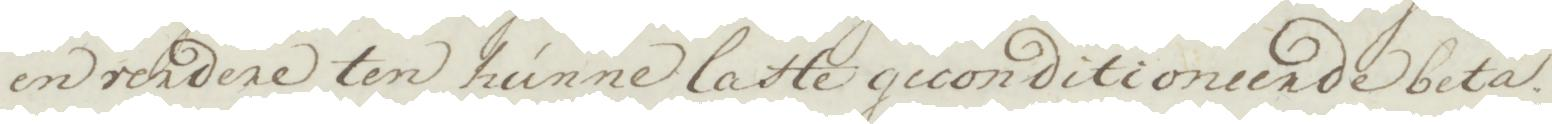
en verdere ten hunne laste geconditioneerde beta„
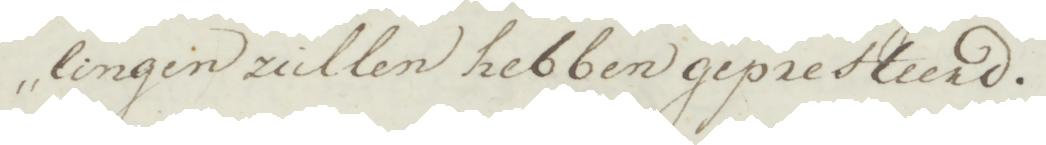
„lingen zullen hebben gepresteerd.
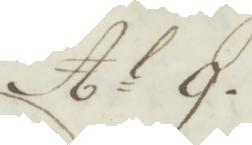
A=l 9.
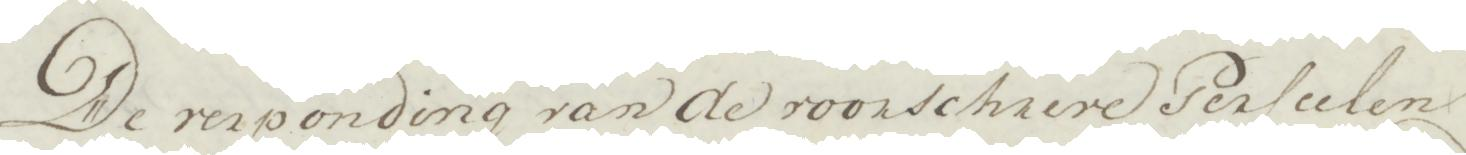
De verponding van de voorschreve Perceelen
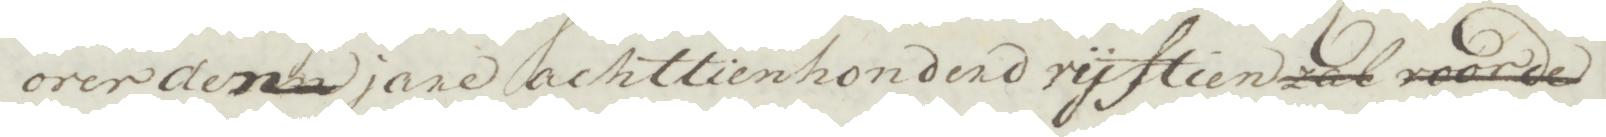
over den jare achttienhonderd vijftien zal voor de
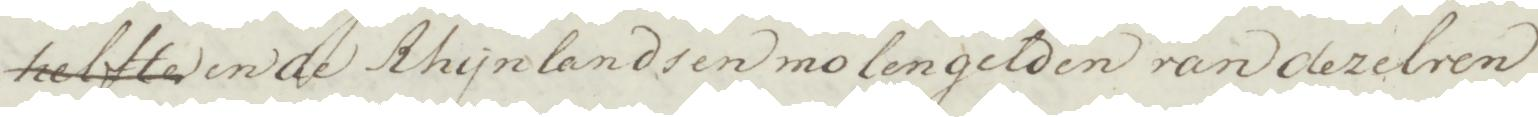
helfte in de Rhijnlandsen molen gelden van dezelven
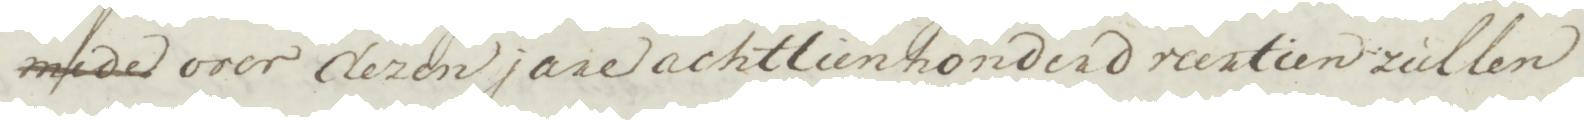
mede over dezen jare achttienhonderd veertien zullen
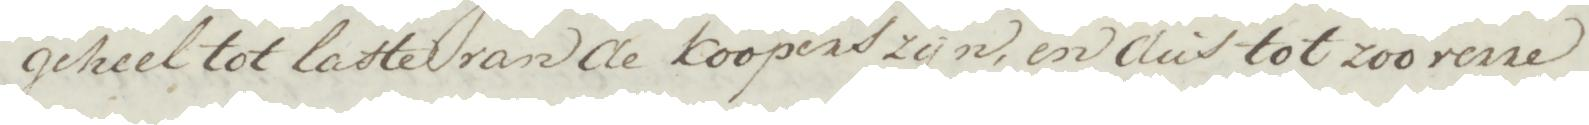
geheel tot laste van de koopers zijn, en dus tot zoo verre
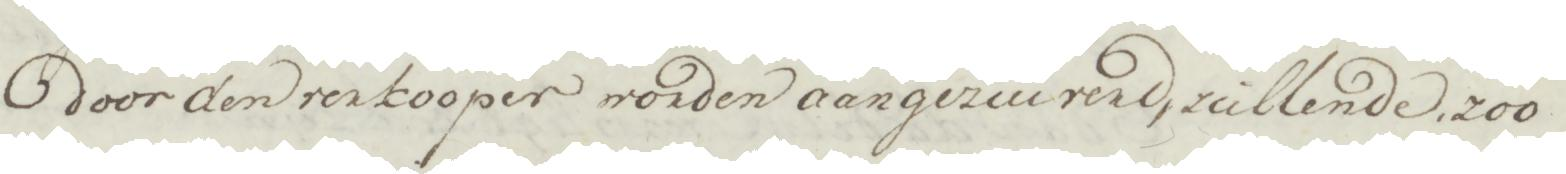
door den verkooper worden aangezuiverd, zullende, zoo
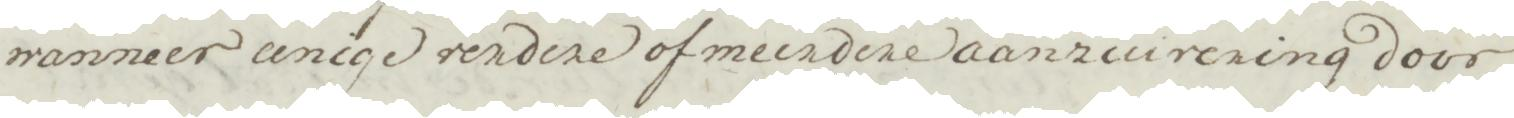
wanneer eenige verdere of meerdere aanzuivering door
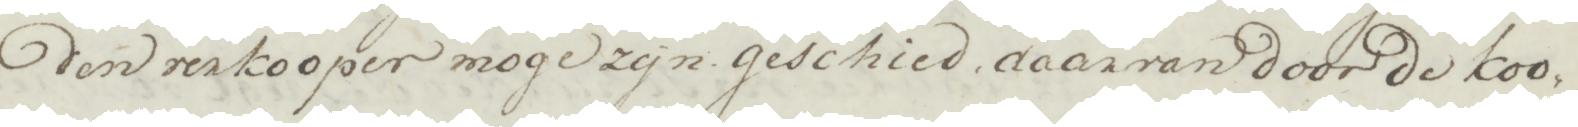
den verkooper moge zijn geschied, daar van door de koo„
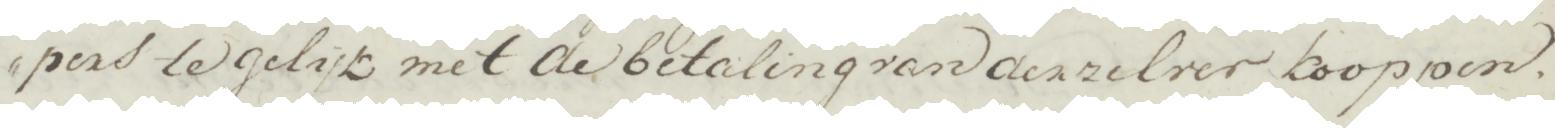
„pers te gelijk met de betaling van derzelver kooppen.
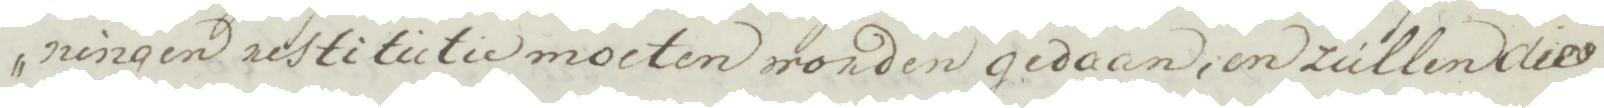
„ningen restitutie moeten worden gedaan, en zullen dies
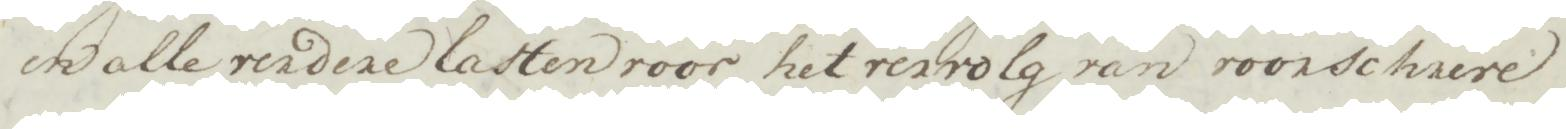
en alle verdere lasten voor het vervolg van voorschreve
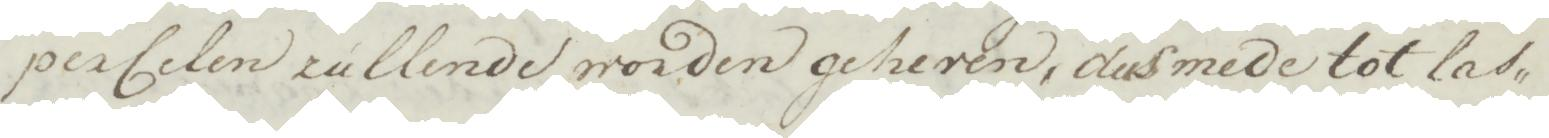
percelen zullende worden geheven, das mede tot las„
